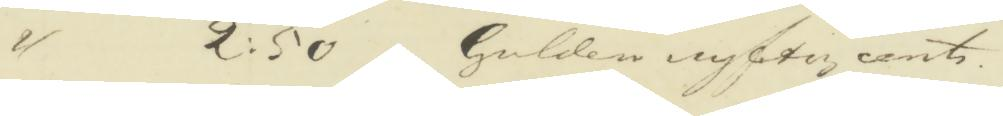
„ 2:50 Gulden vyftig cents.
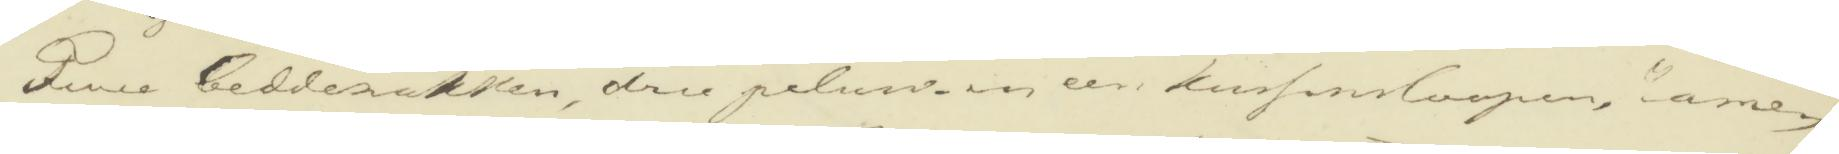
Twee beddezakken, drie peluw- in een kussensloopen, zamen
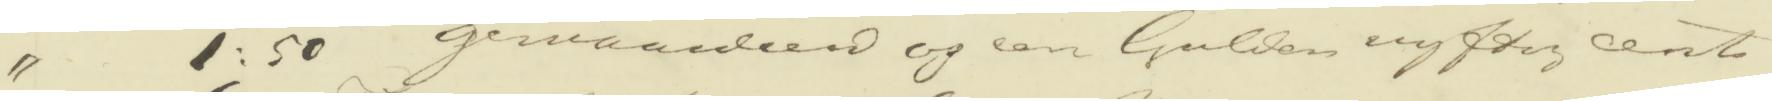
„ 1:50 gewaardeerd of een Gulden vyftig cent
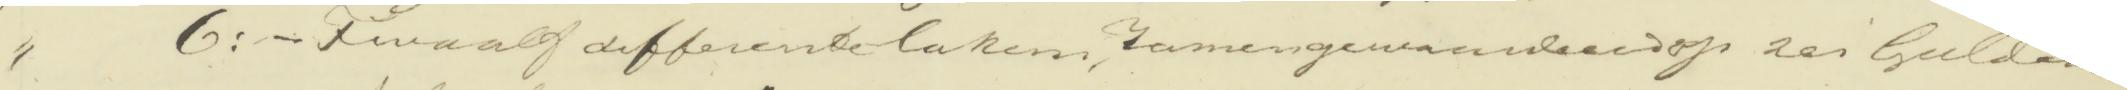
6:— Twaalf difterente lakens, Zamen gewaardeerd op zes Gulden
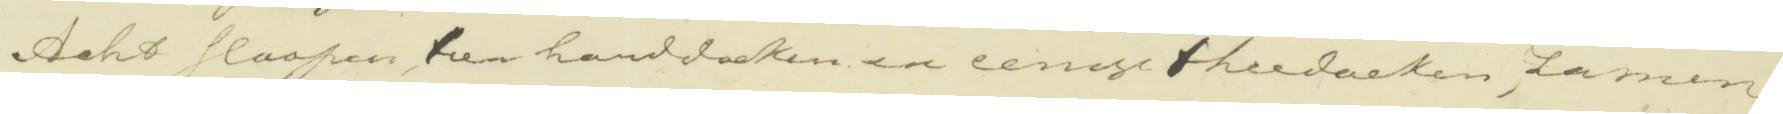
Acht sloopen, tien handdoeken en eenige theedoeken, Zamen
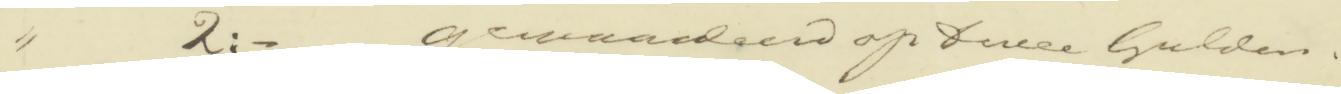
„ 2: — gewaardeerd op twee Gulden.
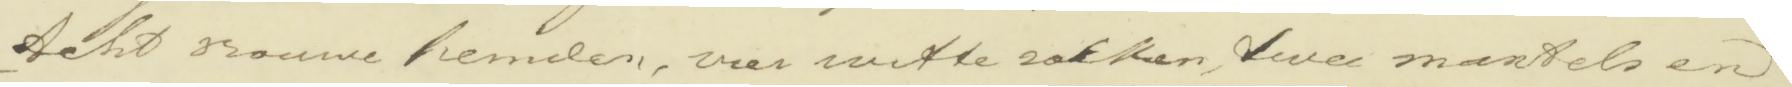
Acht vrouwe hemden, vier witte zakken, twee mantels en
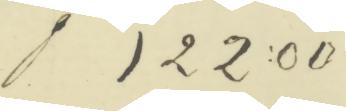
ƒ 122:00
